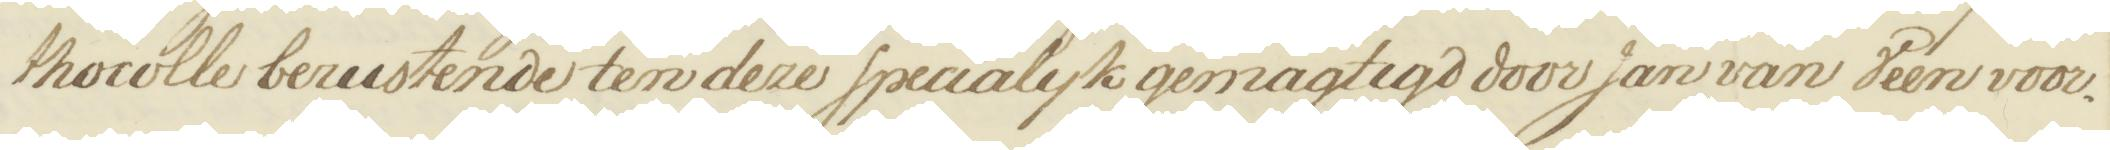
thocolle berustende ten deze specialyk gemagtigd door Jan van Veen voor„
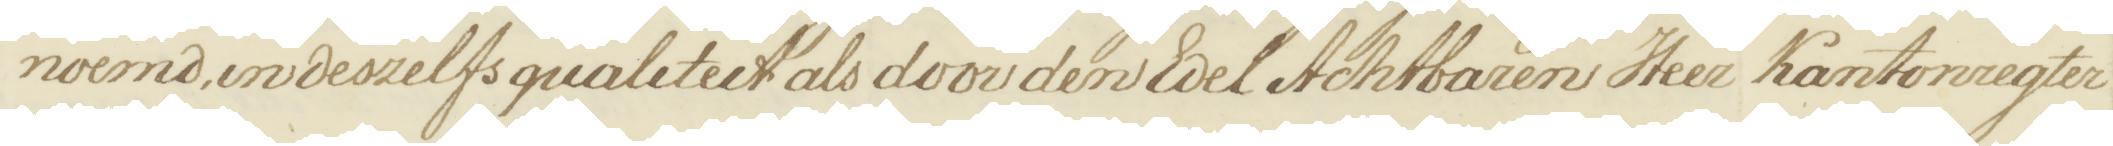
noemd, in deszelfs qualiteit als door den Edel Achtbaren Heer Kantonregter
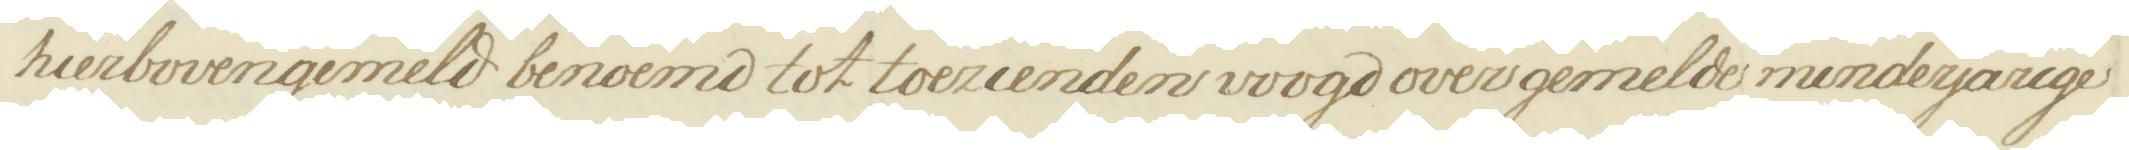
hierboven gemeld benoemd tot toezienden voogd over gemelde minderjarige
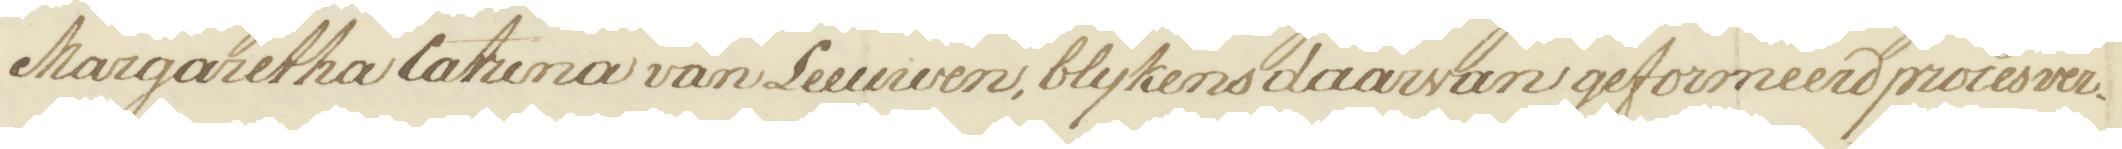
Margaretha Catrina van Leeuwen, blykens daarvan geformeerd proces ver„
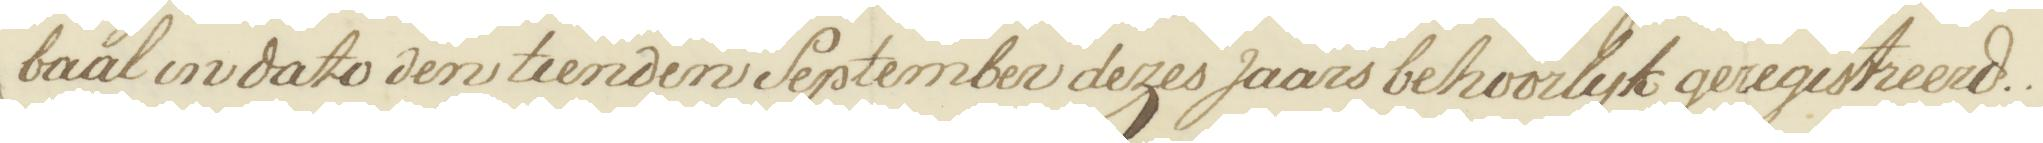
baal in dato den tienden September dezes Jaars behoorlyk geregistreerd..
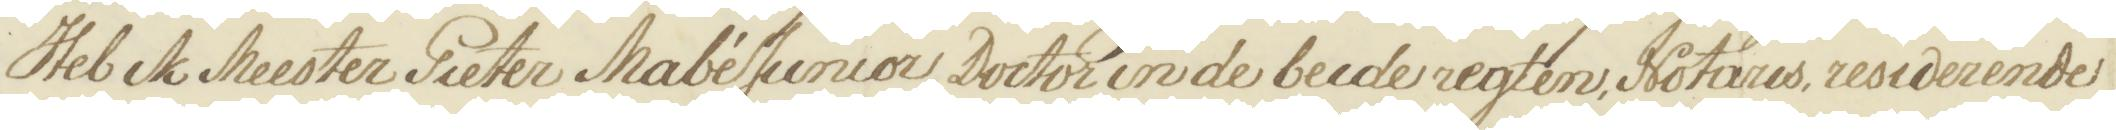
Heb ik Meester Pieter Mabé Junior, Doctor in de beide regten, Notaris, residerende
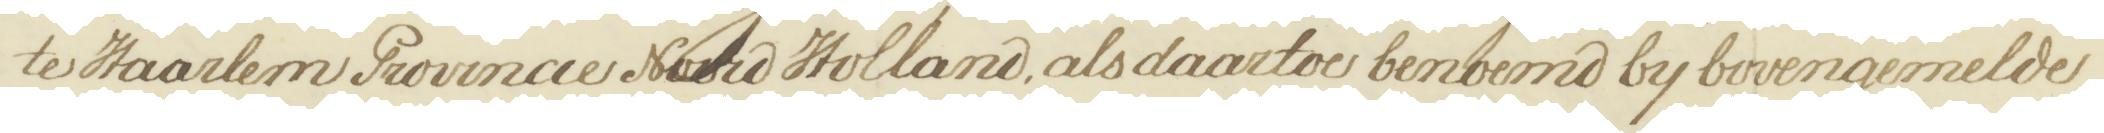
te Haarlem Provincie Noord Holland, als daartoe benoemd by bovengemelde
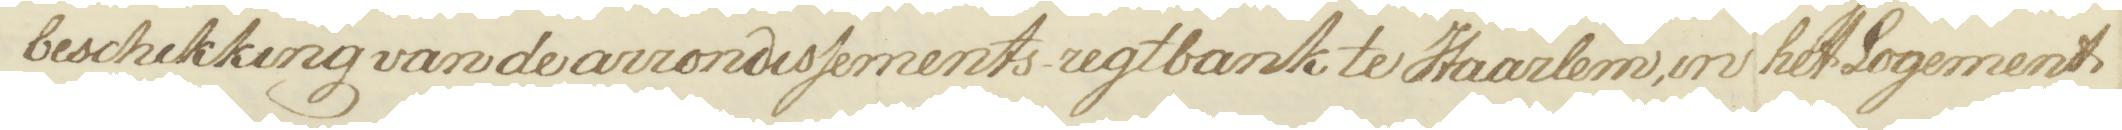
beschikking van de arrondissements regtbank te Haarlem, in het Logement
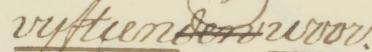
vyftienden woor„
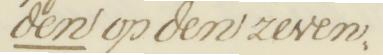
den op den zeven.
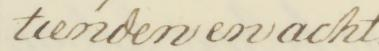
tienden en acht
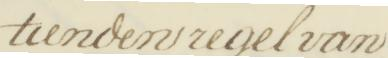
tienden regel van
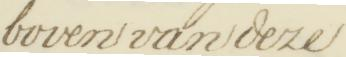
boven van deze
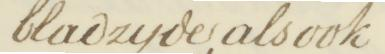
bladzyde, als ook
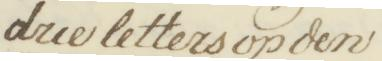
drie letters op den
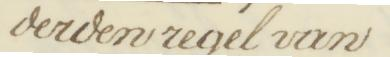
derden regel van
